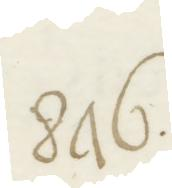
846.
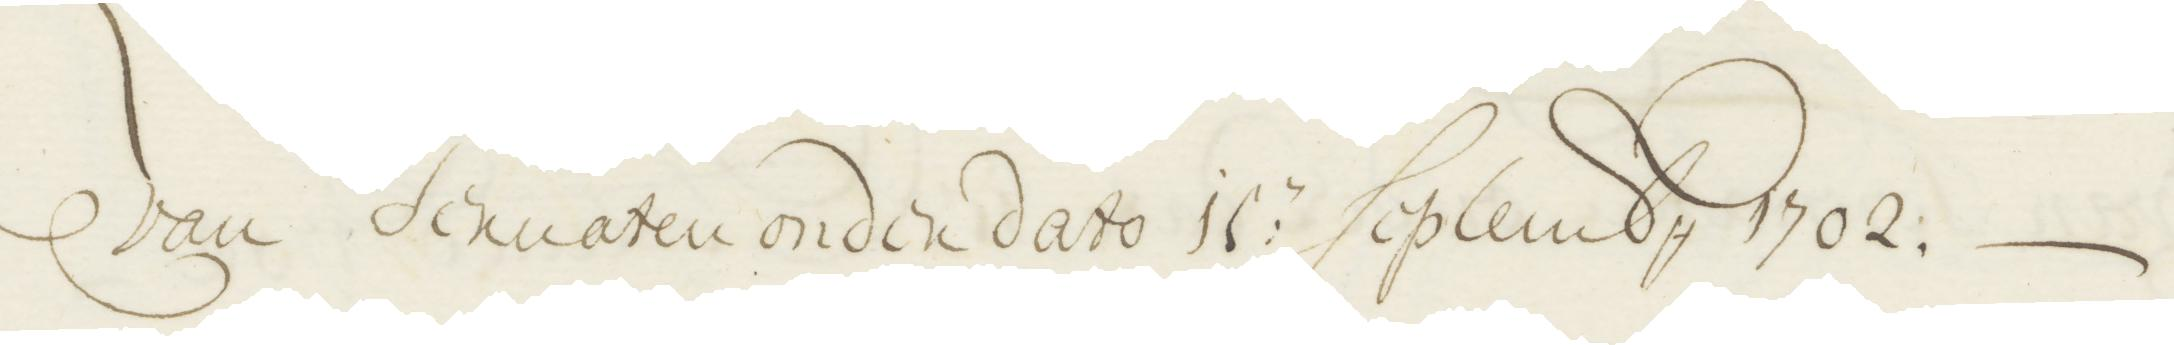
Van Ternaten onder dato 15:en septemb„ 1702: —
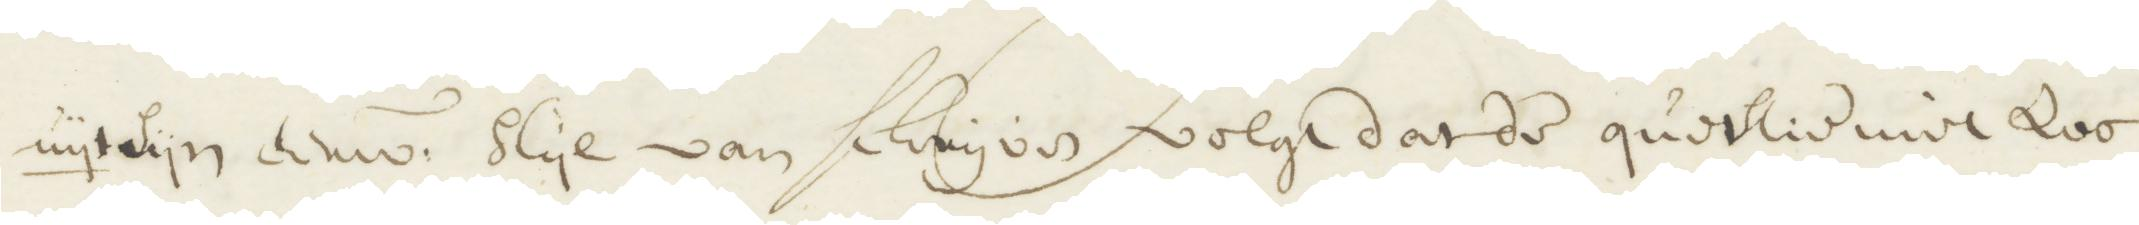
uijt sijn eerw: stijl van schrijven volgt dat de questie niet zoo
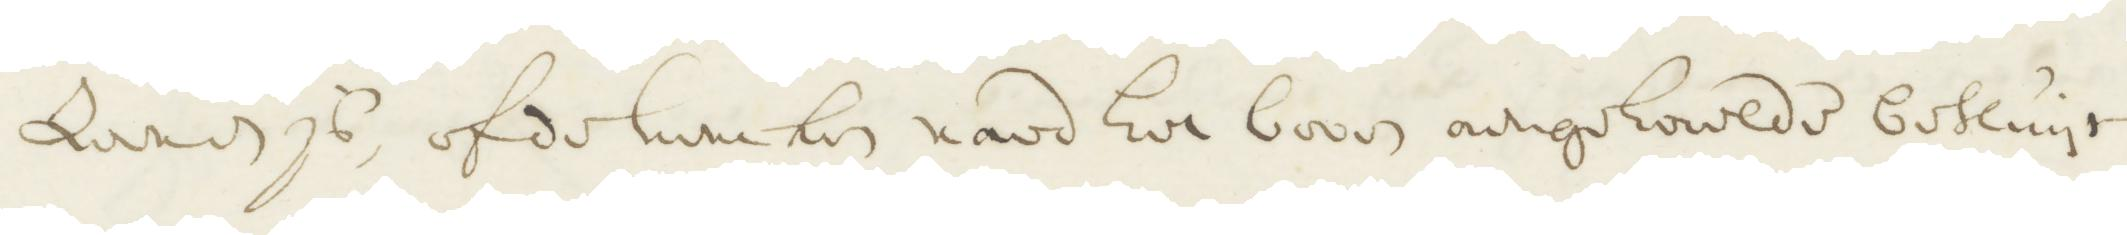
zeeren js, of de kercken raed het boven aengehaelde besluijt
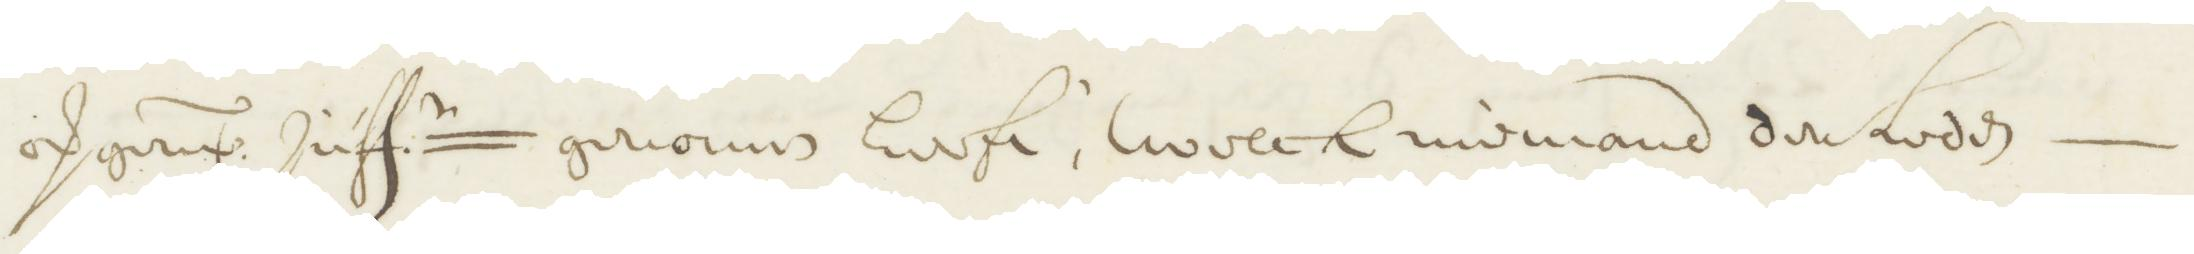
over gem: Juff=r genomen heeft, 'twelck niemand der leden —
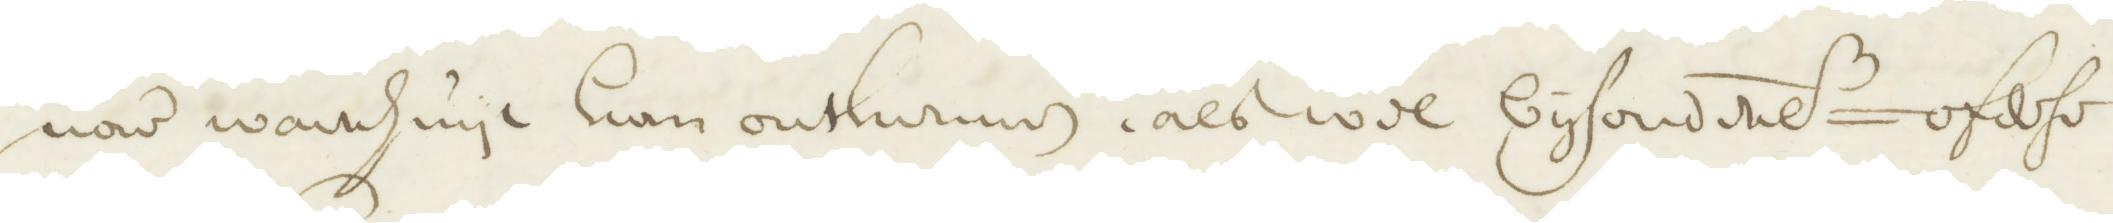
nae waerheijt kan ontkennen als wel bijsonderlijk of dese
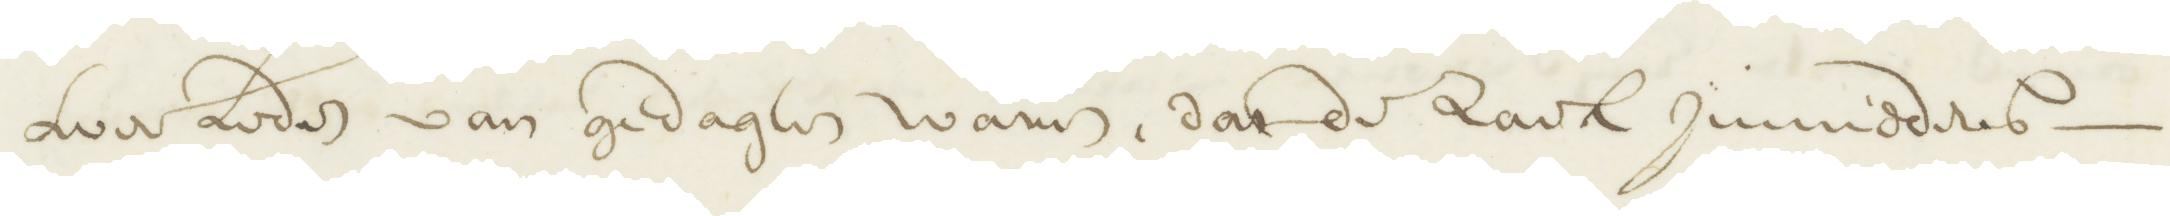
twee leden van gedagten waren, dat de zaek jnmiddens —
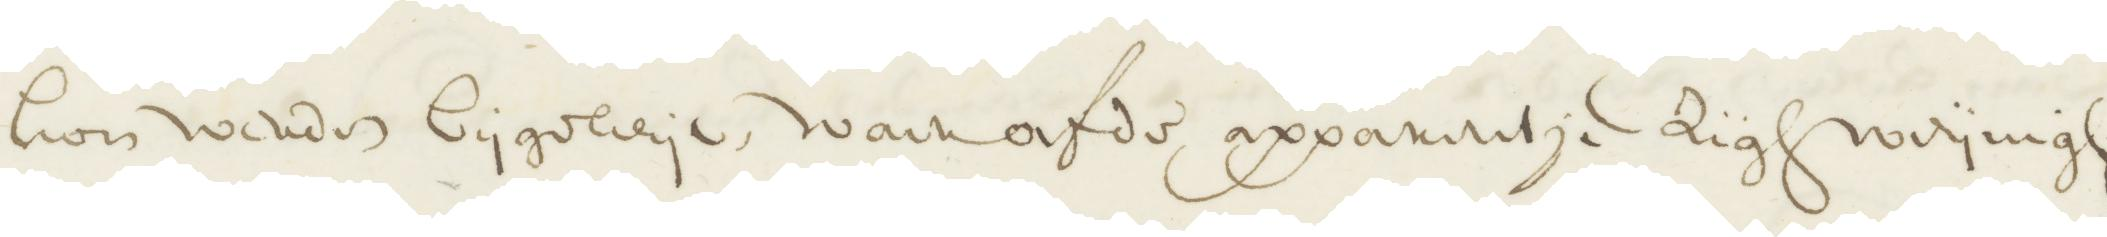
kon werden bij geleijt, waer af de apparentje zigh weijnigh
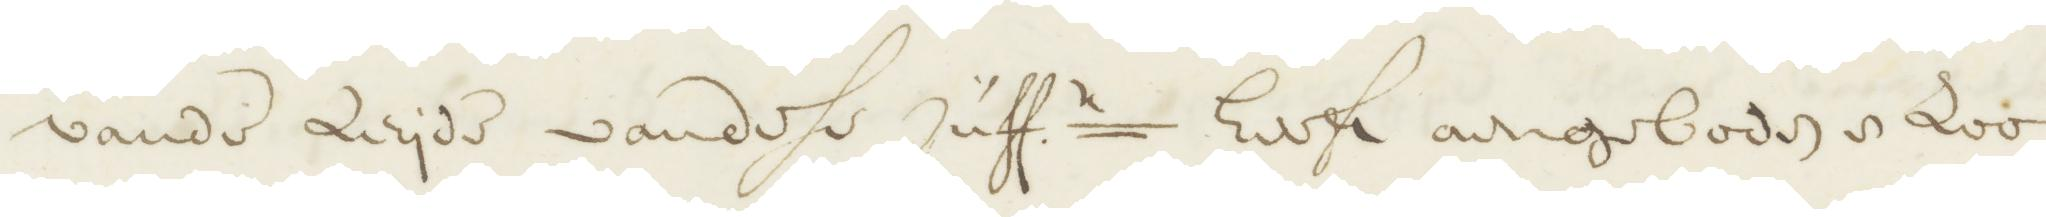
vande zeijde vandese Juff=r heeft aengeboden en zoo
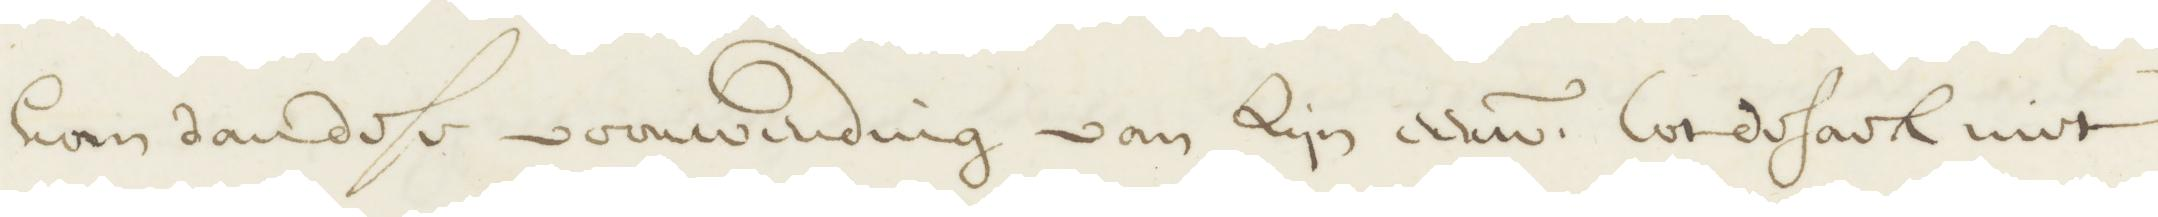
kon dan dese voorwending van zijn eerw. tot desaek niet
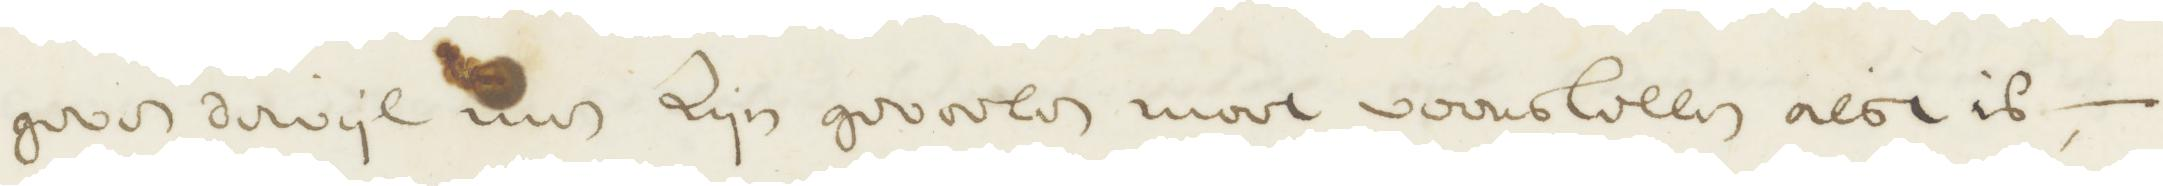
geven dewijl men zijn gevoelen moet voorstellen alst is, —
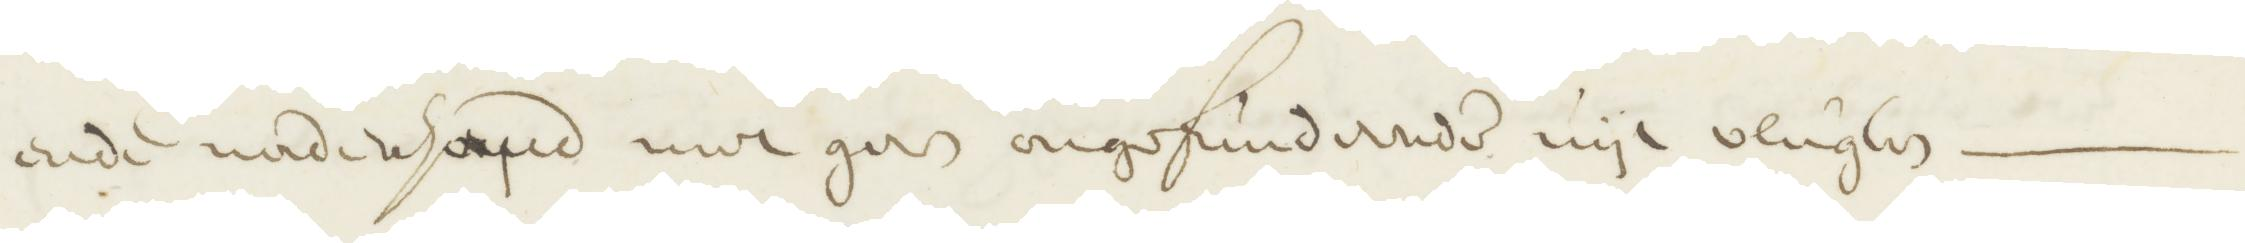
ende naderhand met geen ongefundeerde uijt vlugten —
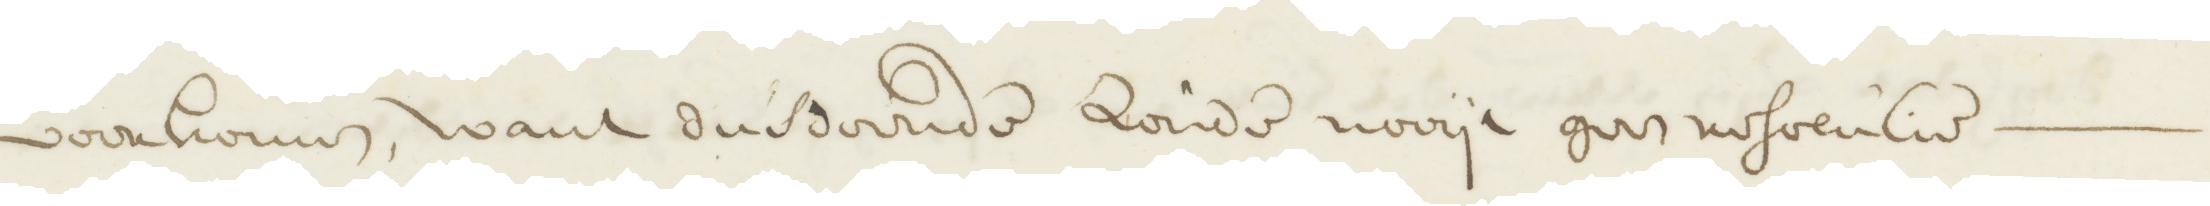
voorkomen, want dusdoende zoude nooijt geen resolutie —
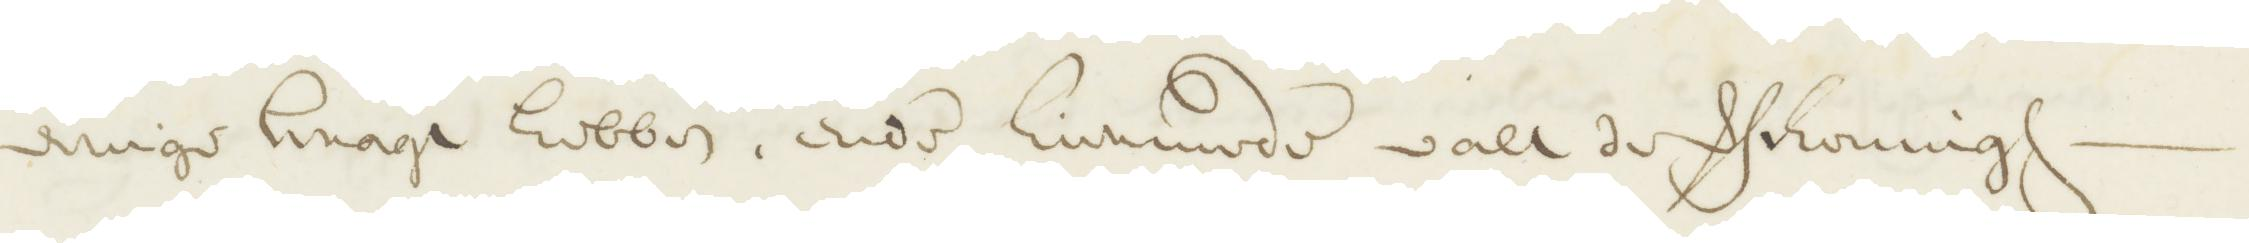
eenige kragt hebben, ende hiermede valt de verschoningh
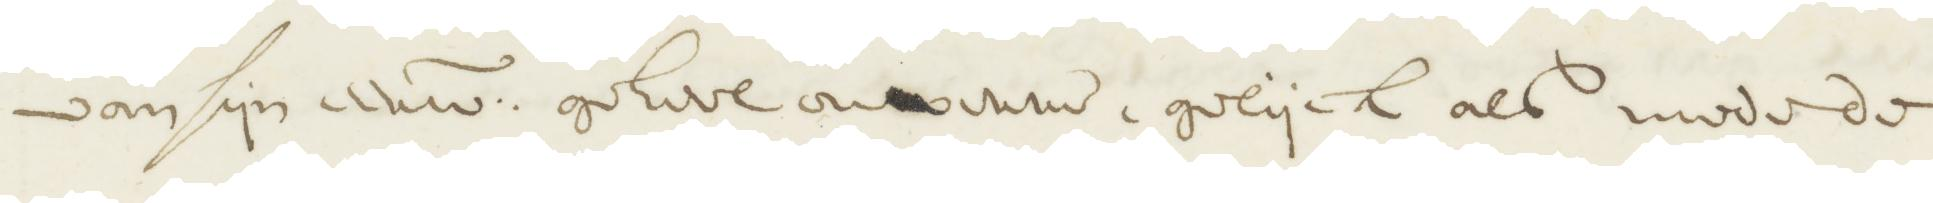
van sijn eerw: geheel omverre, gelijck als mede de
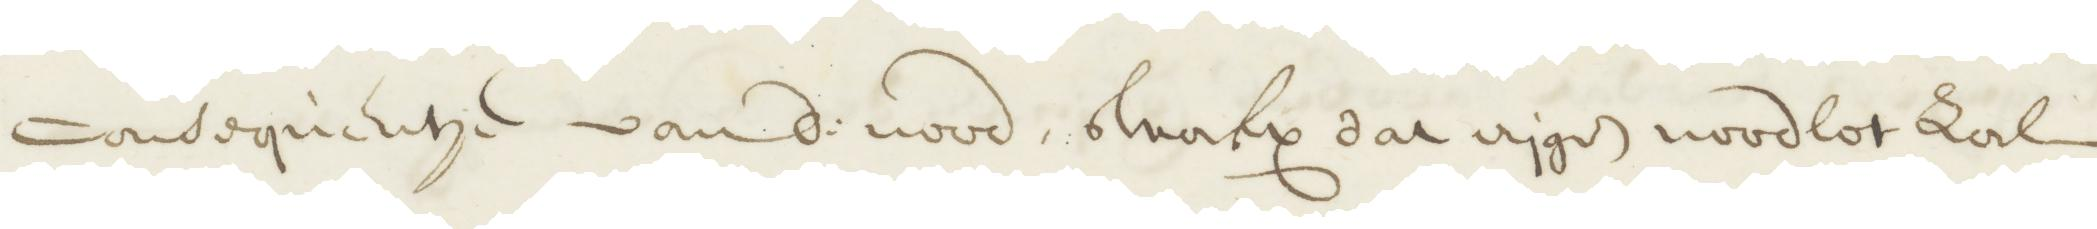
consequentje van d: nood, strakx dat eijgen noodlot zal
